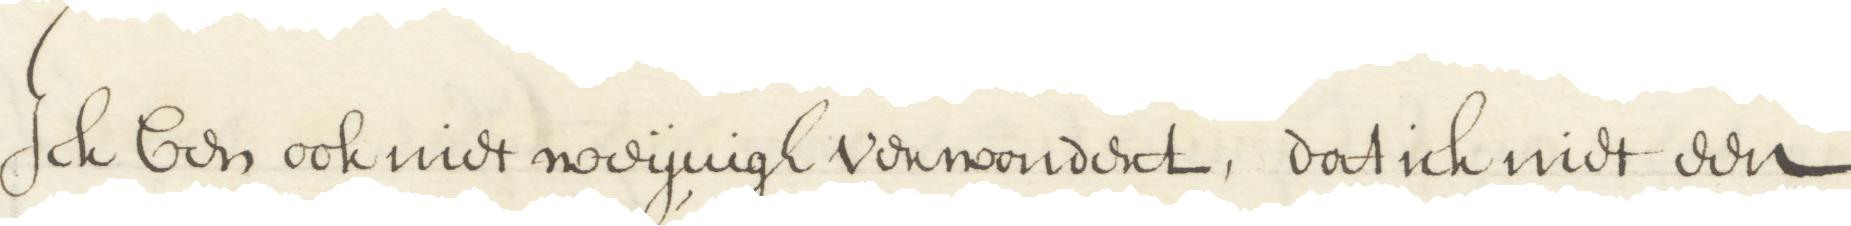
Ich ben ook niet weijnigh verwondert, dat ick niet een
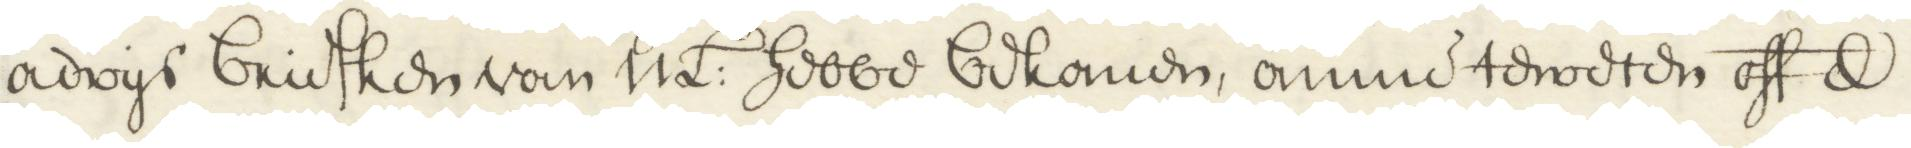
advijs briefken van UL: hebbe bekomen, omme teweten off de
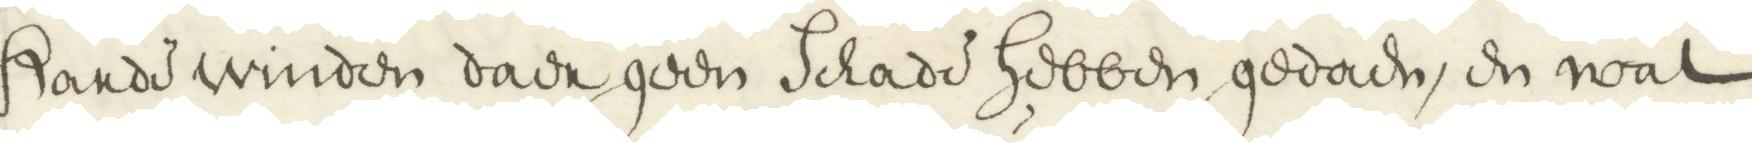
Harde winden daer geen schade hebben gedaen, en wat
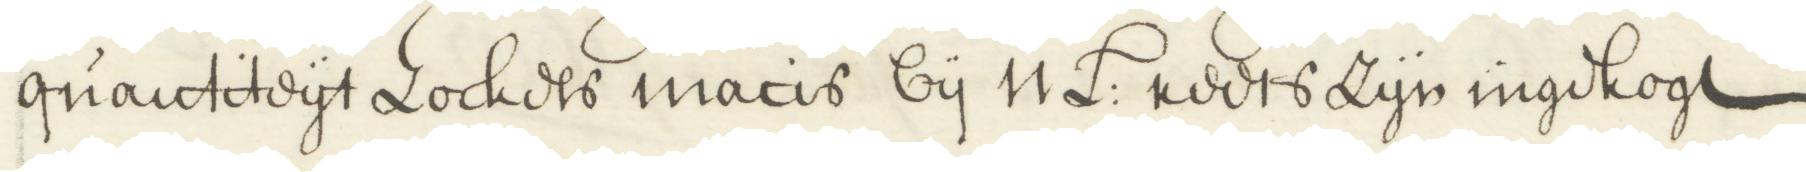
quantiteijt zockels macis bij UL: reets zijn ingekogt
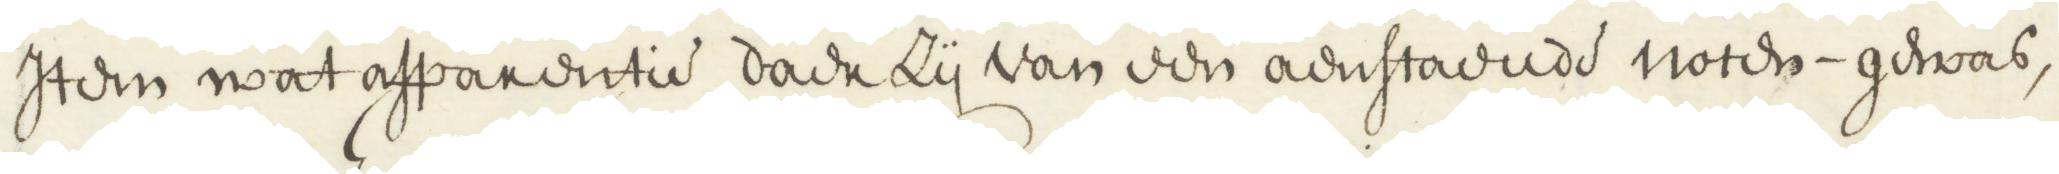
Item wat apparentie daer zij van een aenstaende noten-gewas,
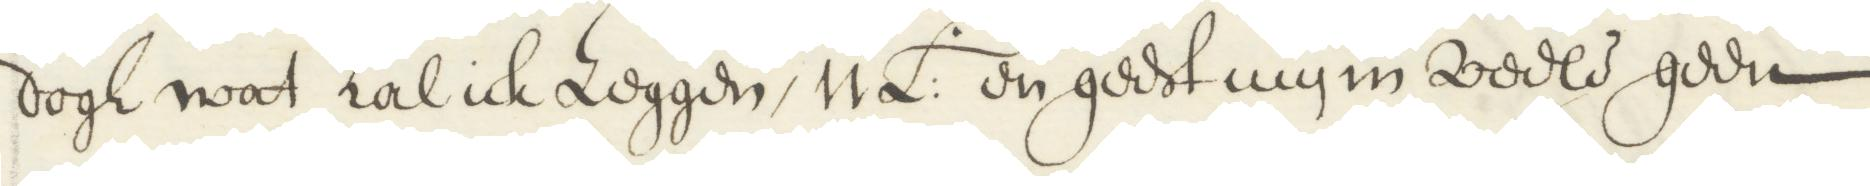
dogh wat zal ick zeggen, UL: en geeft mij in veele geen
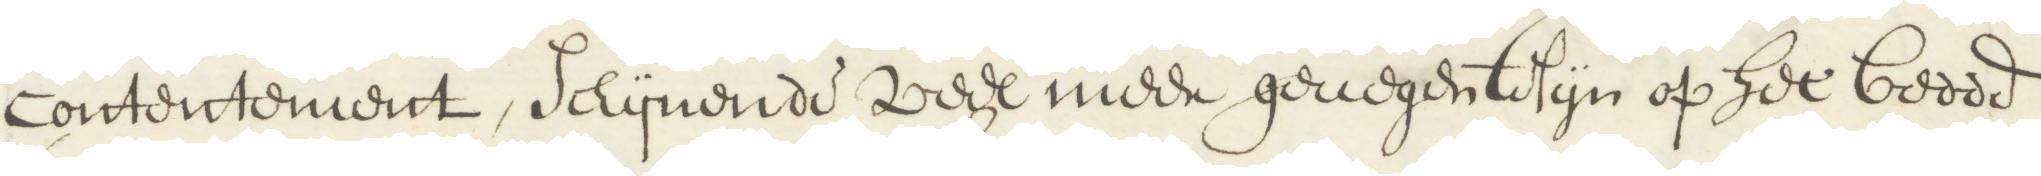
contentement, schijnende veel meer genegen tesijn op het bedde
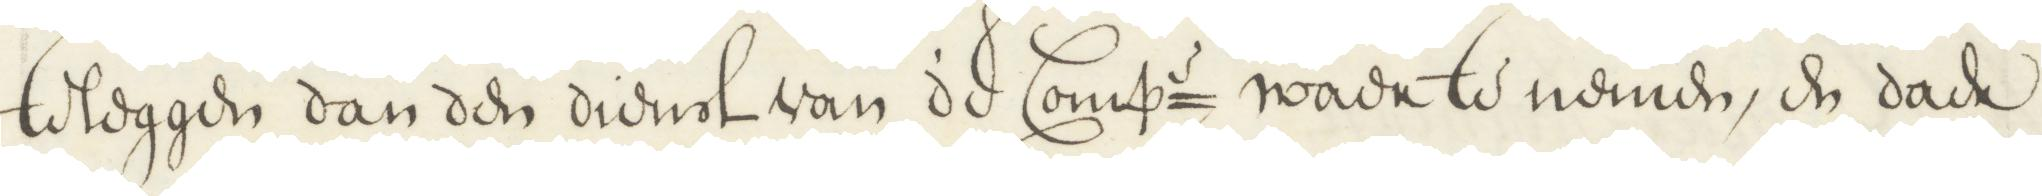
teleggen dan den dienst van d' E Comp=s waer te nemen, en daer
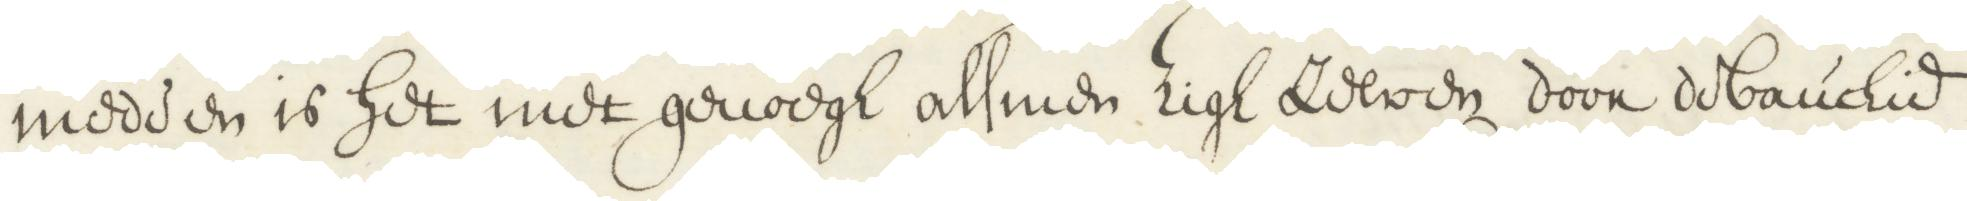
mede en is het niet genoegh alsmen zigh zelven door debauchie
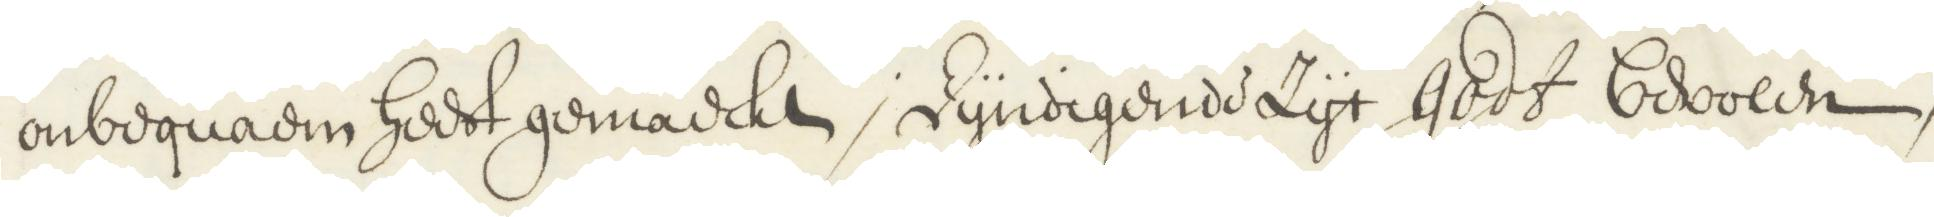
onbequaem heeft gemaekkt, Eijndigende zijt Godt bevolen
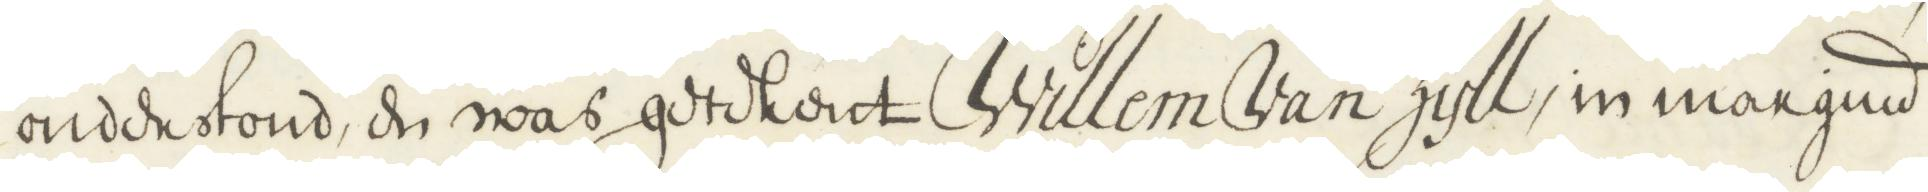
onderstond, en was getekent Willem van Zijll, in margine
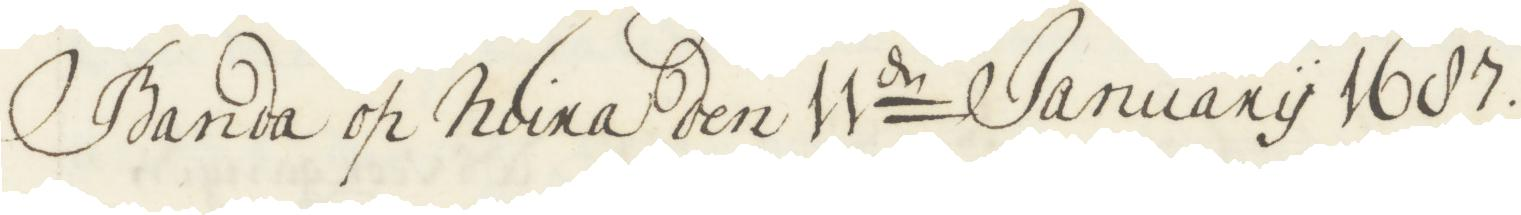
Banda op neira den 11=en Januarij 1687.
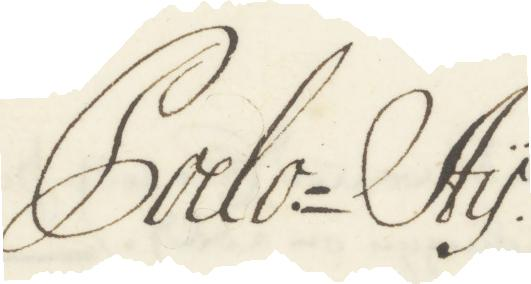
Poelo.= Aij
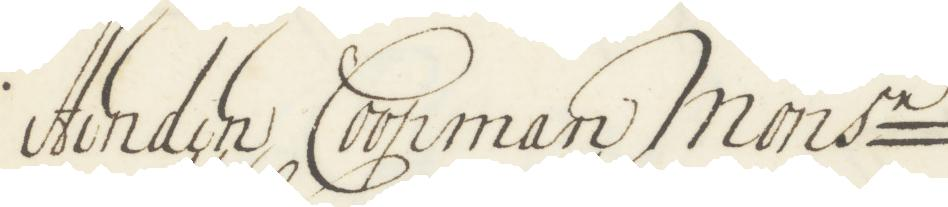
Aenden Coopman Mons=r
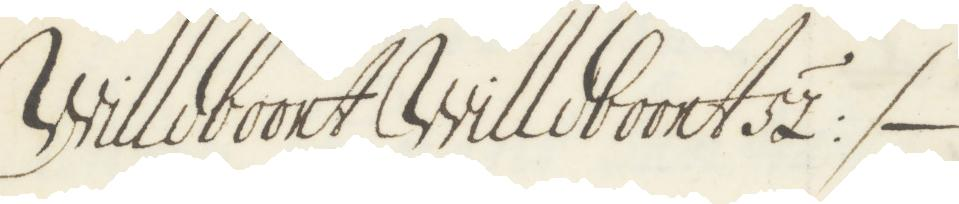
Willeboort Willeboortsz: /—
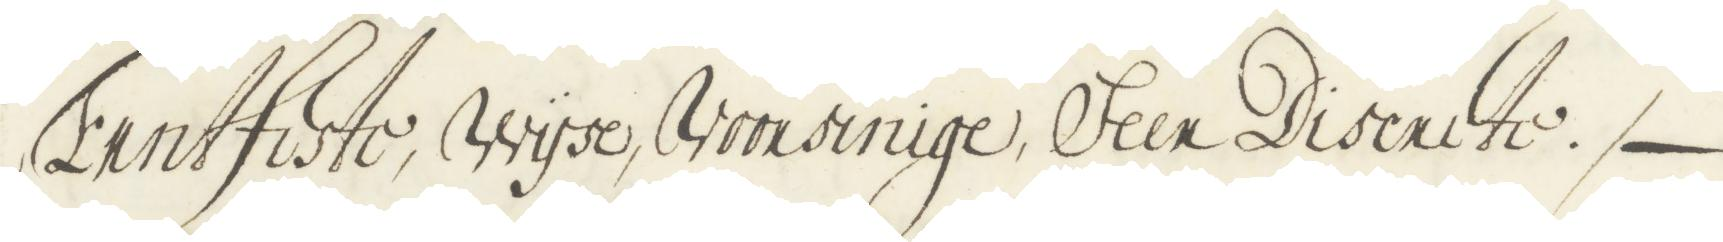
Erntfiste, wijse, voorsinige, seer Discrete. /—
